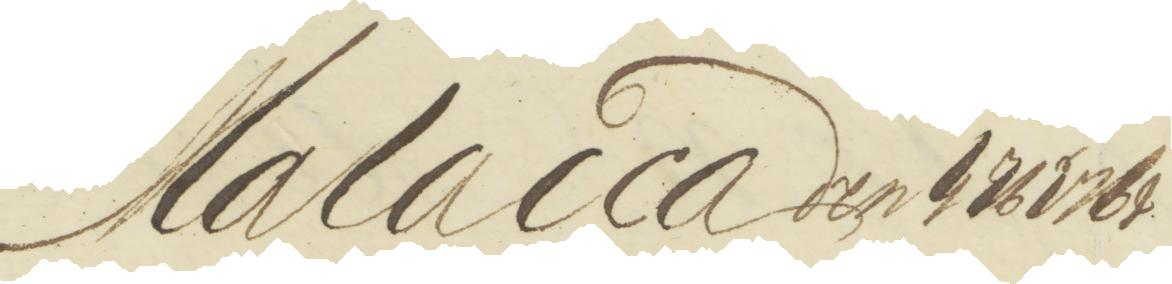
Van Malacca den 176 1764
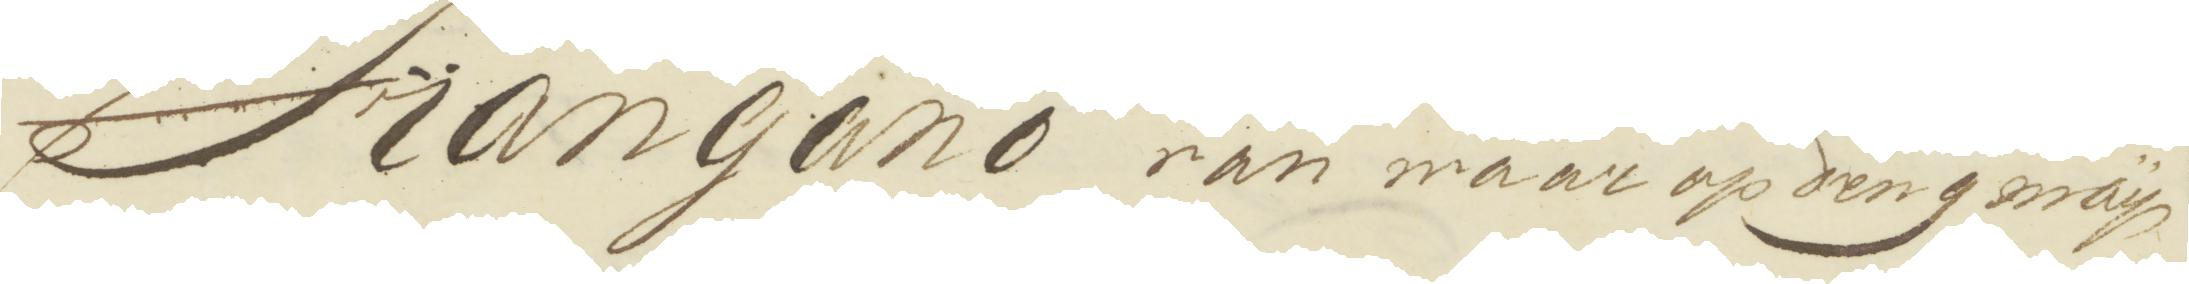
Tiangano van waar op den 9 maij
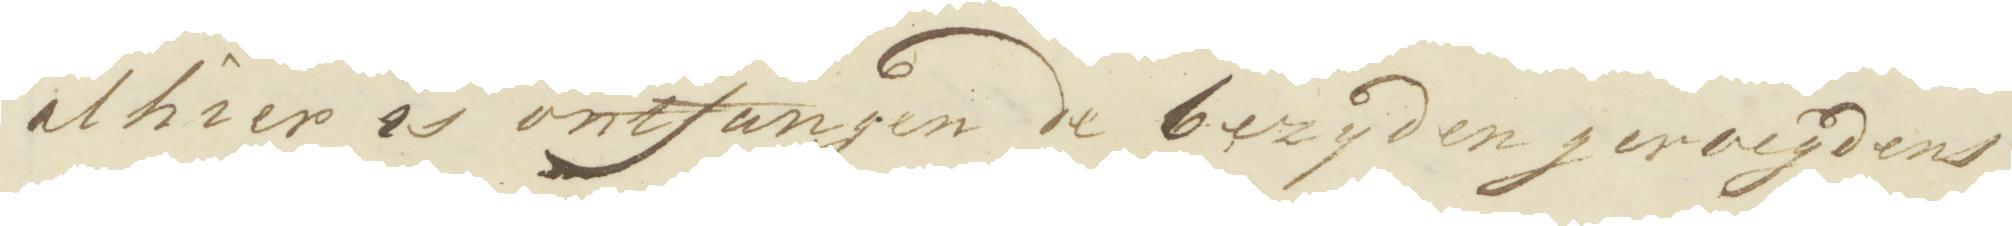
alhier is ontfangen de bezyden gevoegdens
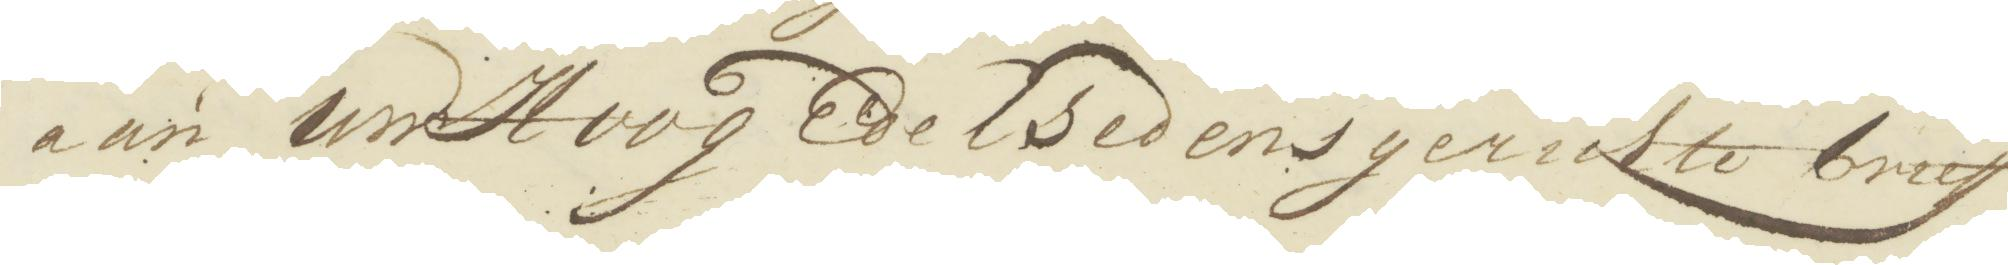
aan uw Hoog Edelhedens gereette brieff
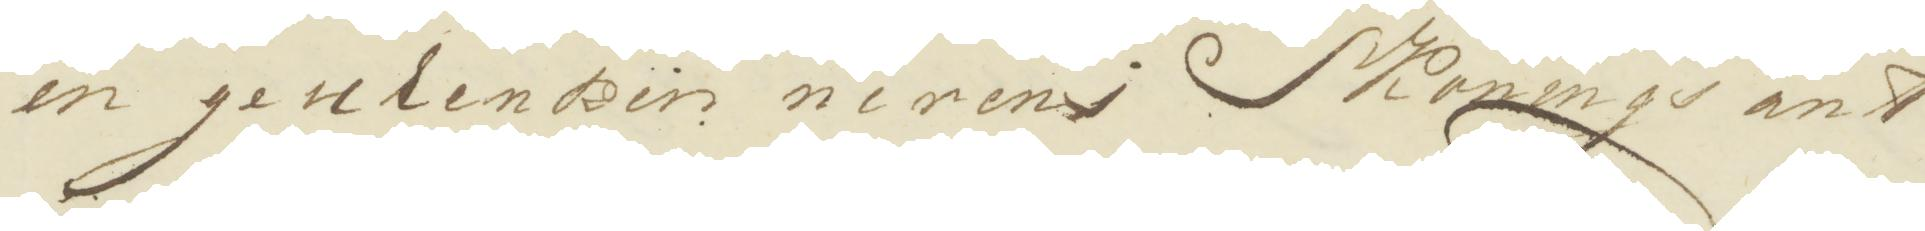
en geselenden nevens 's Konings ant
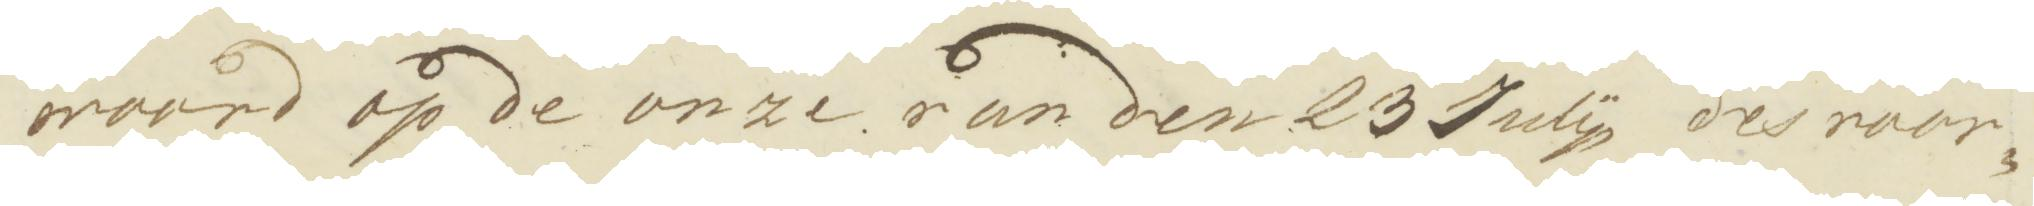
woord op de onze van den 23 Julij des voor„
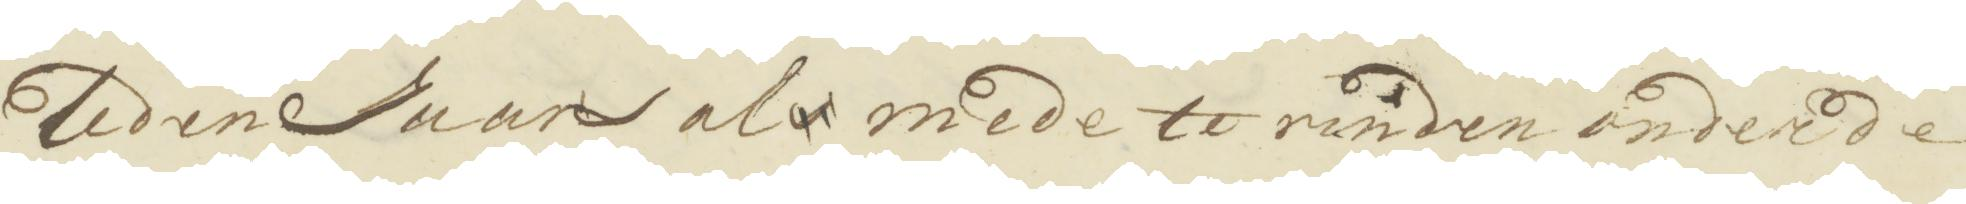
leden Iaar als mede te vinden onder de
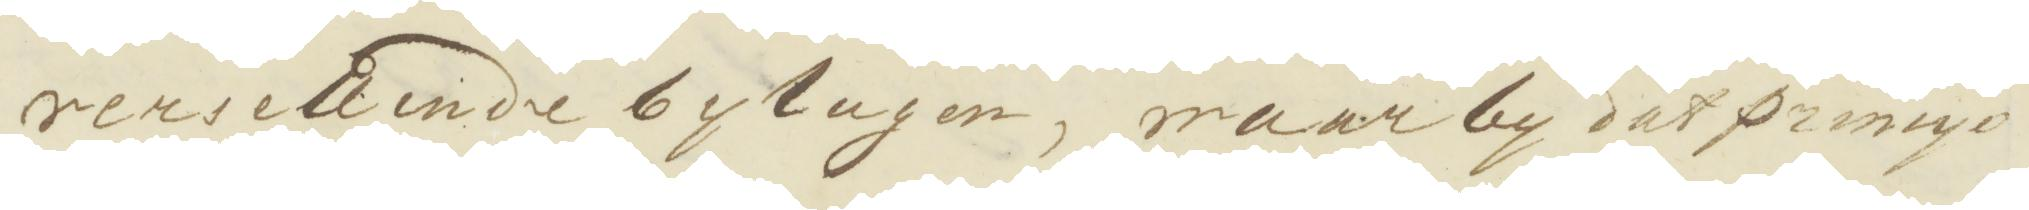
versellende bylagen, waar by dat primjo
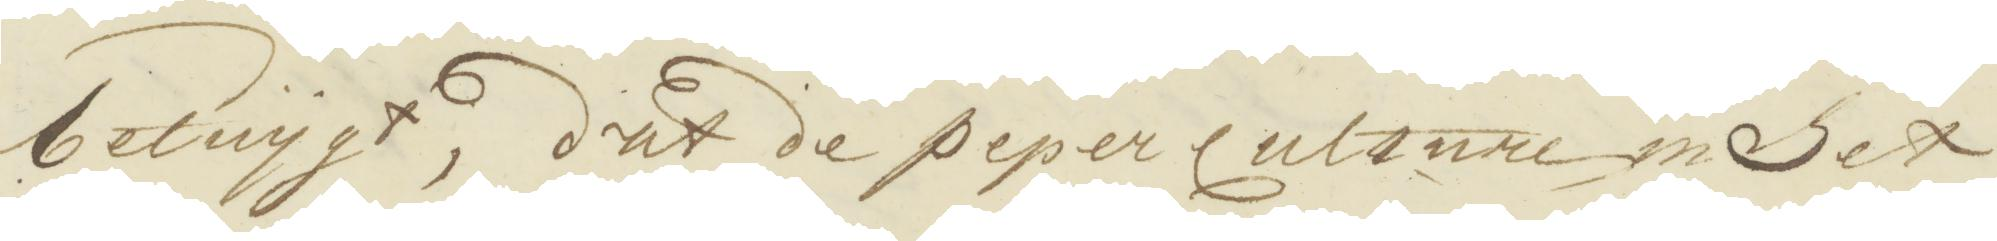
betuijgt, dat de peper Cutture in het
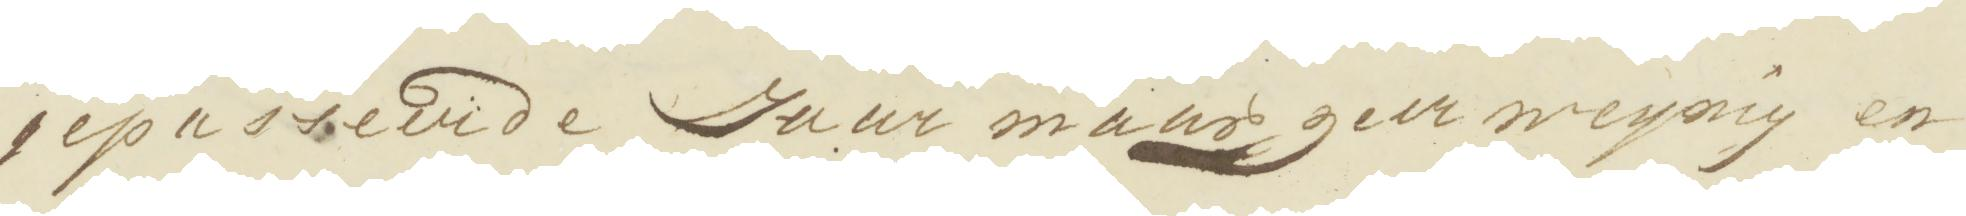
gepasseerde Iaar maar zeer weijnig en
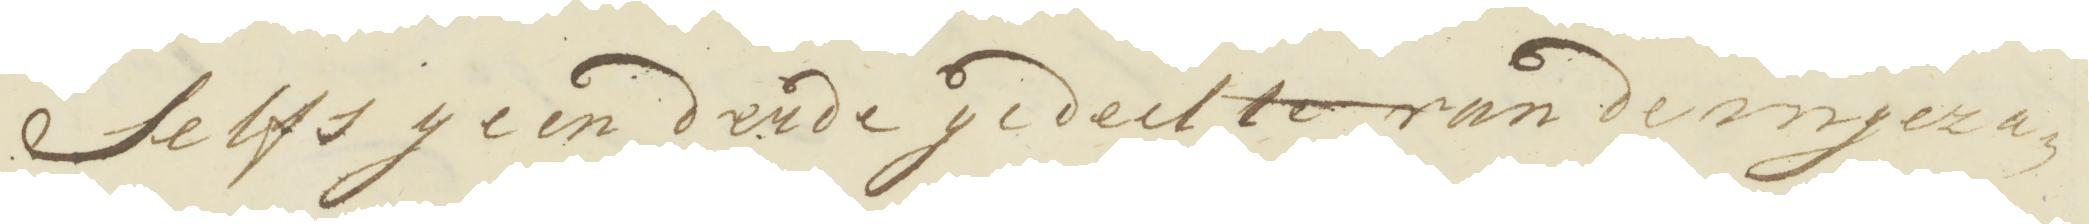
Selfs geen derde gedeelte van de ingeza
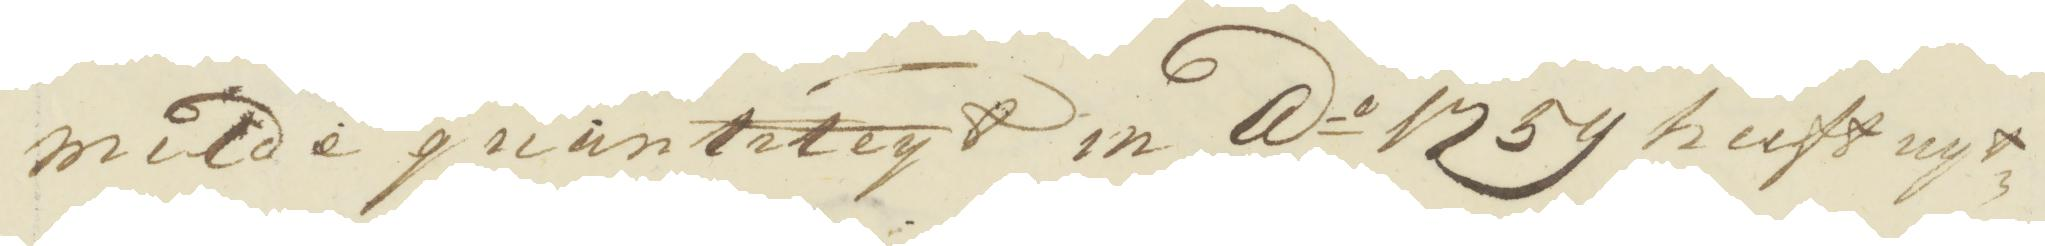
melde quantiteijt in A=o 1759 heeft uyt
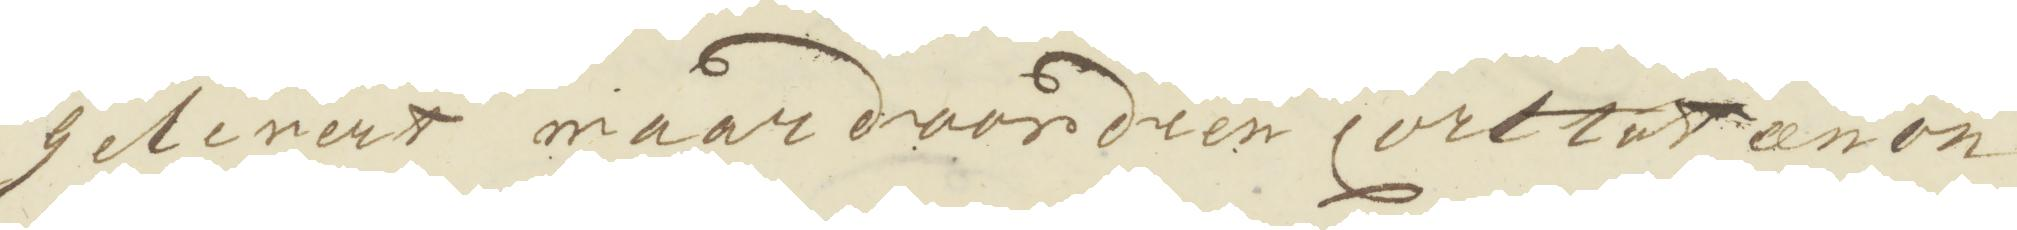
gelevert maar door dien cort tot een on
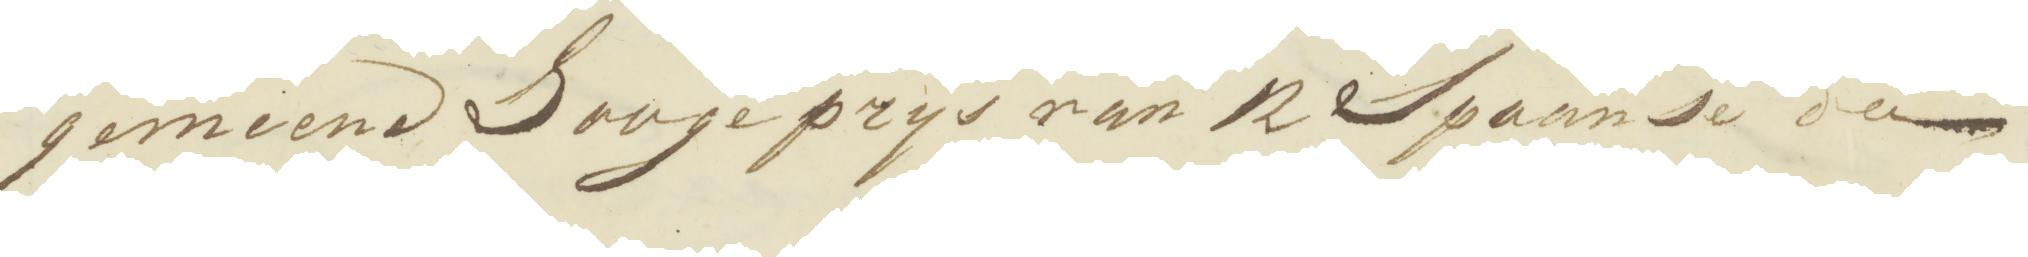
gemiend hooge prys van 12 spaanse den
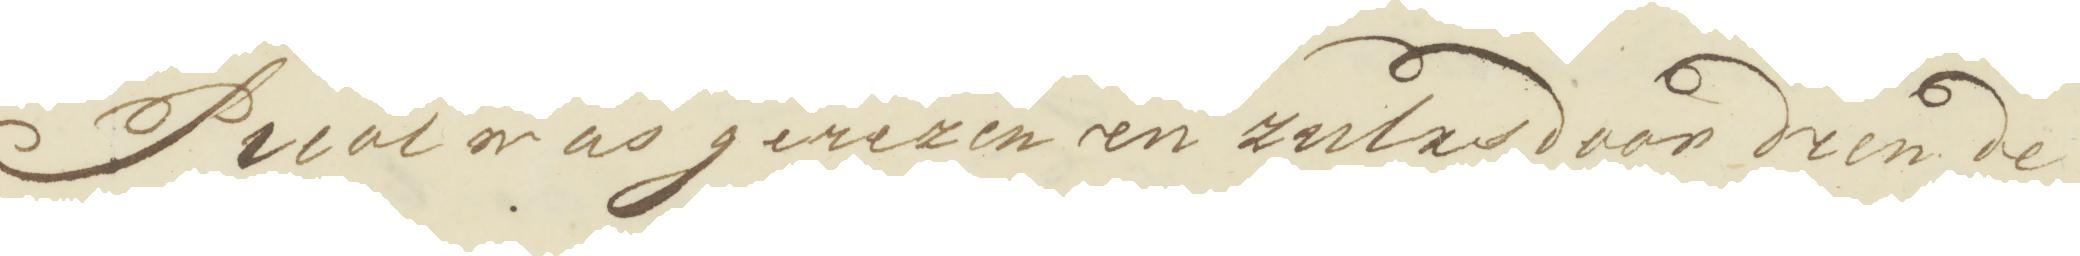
Prial was gerezen en zulxs door dien de
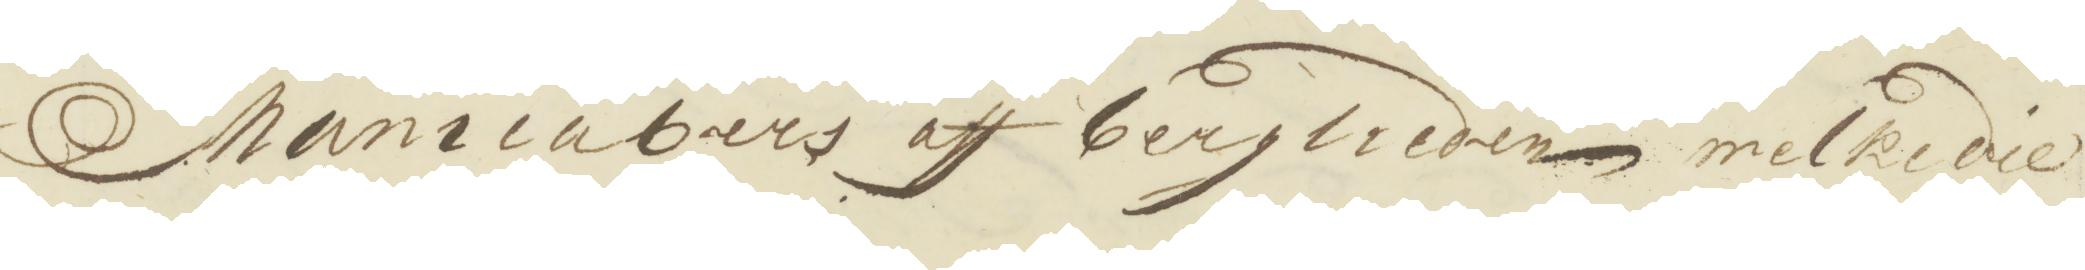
Manicabers off berglieden welke die
